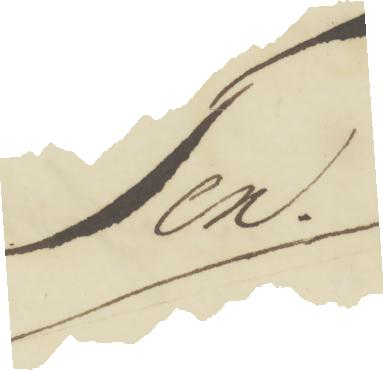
Ter.
